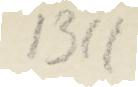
1311
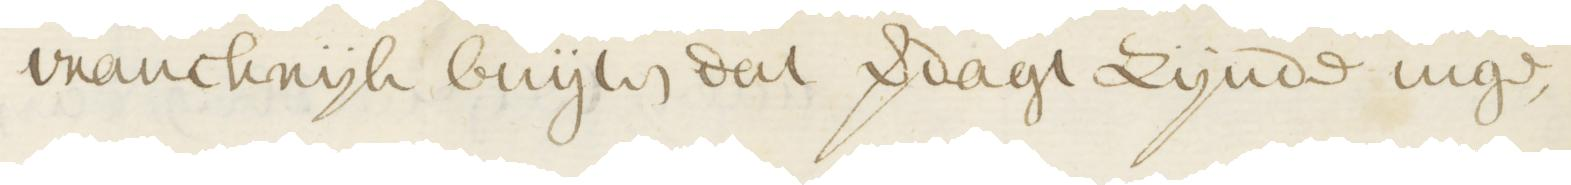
vranckrijk buijten dat verdagt zijnde inge,
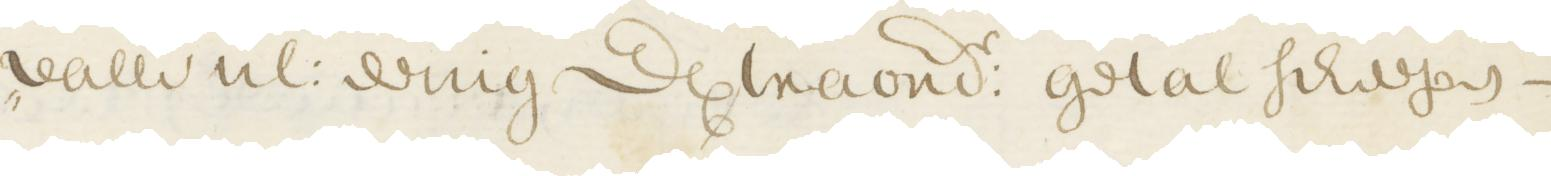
„valle ue: eenig Extraord:r getal scheepen
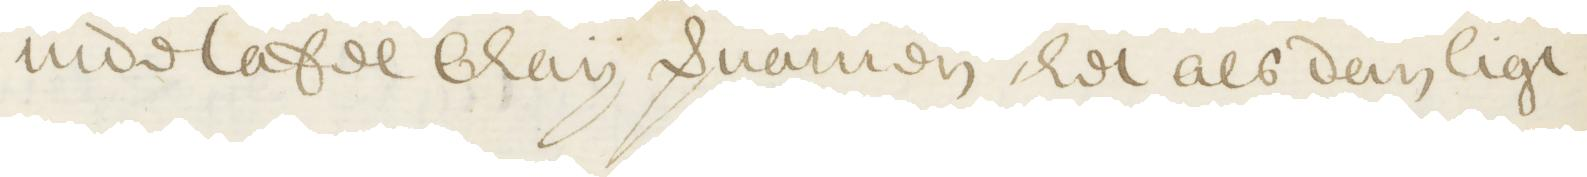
inde tafel bhaij vernamen, het als dan ligt
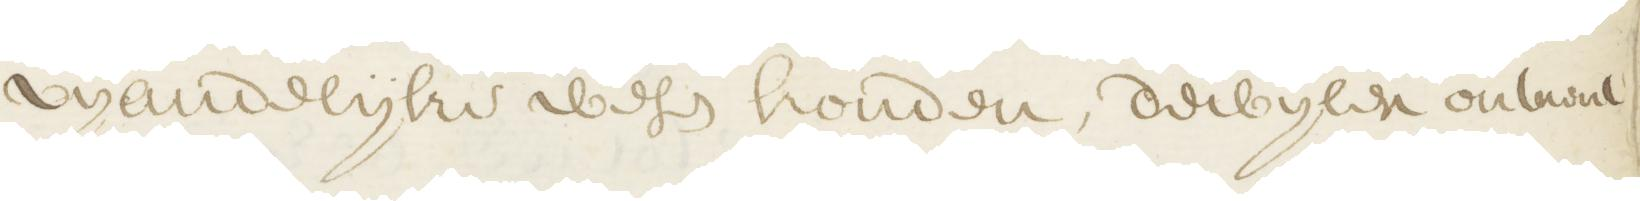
vijandelijke wesen konden, dewijlen ontrent
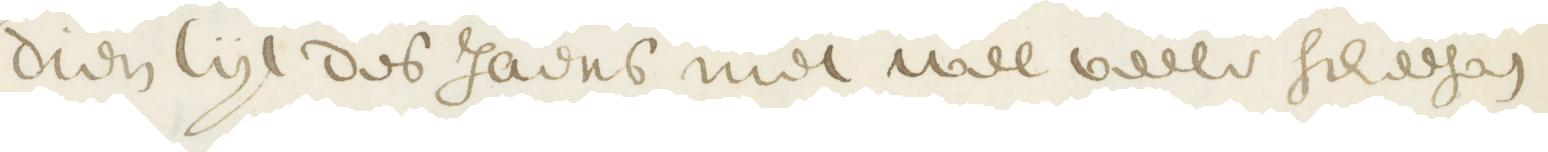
dien tijt des jaers niet wel veele scheepen
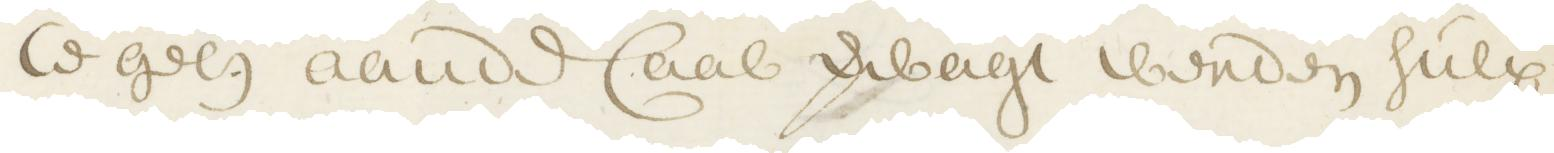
te gelijk aan de Caab verwagt werden sulx
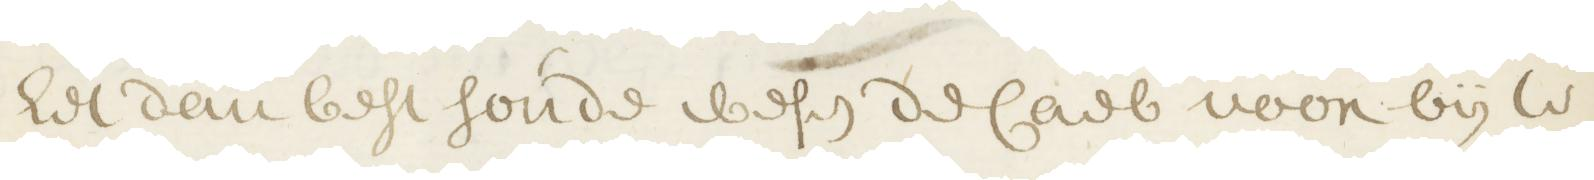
het dan best soude wesen de Caeb voor bij te
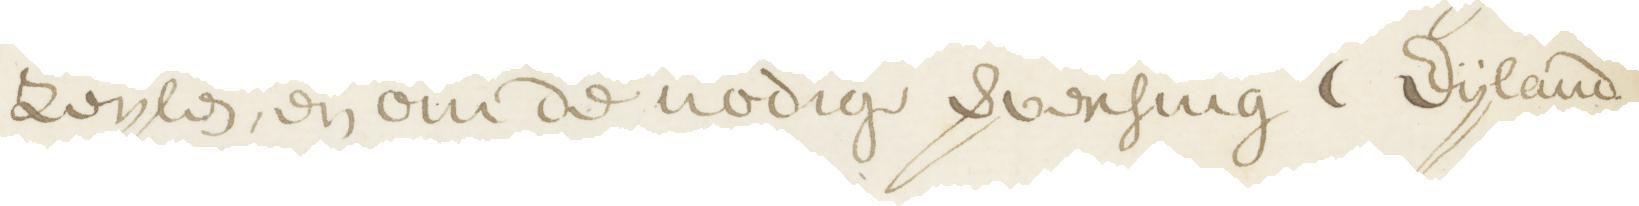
zeijlen, en om de nodige verversing 't Eijland
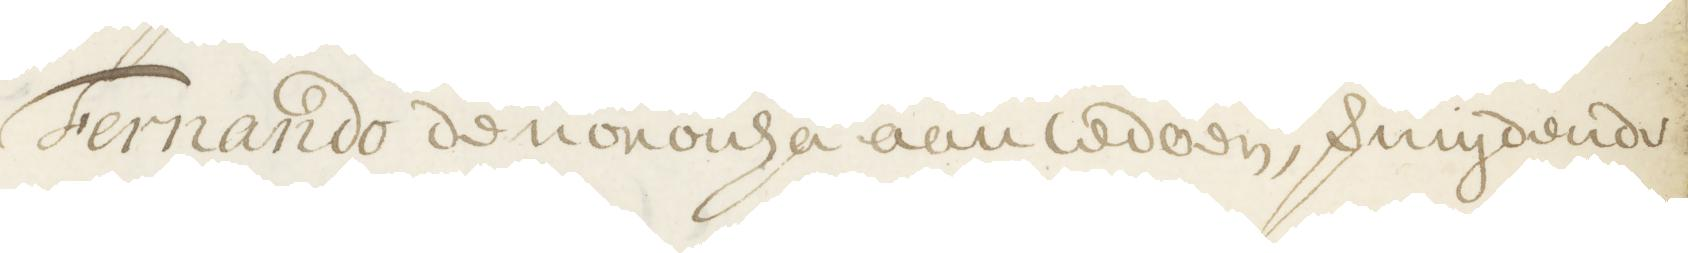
Fernando de noronha aan tedoen, vermijdende
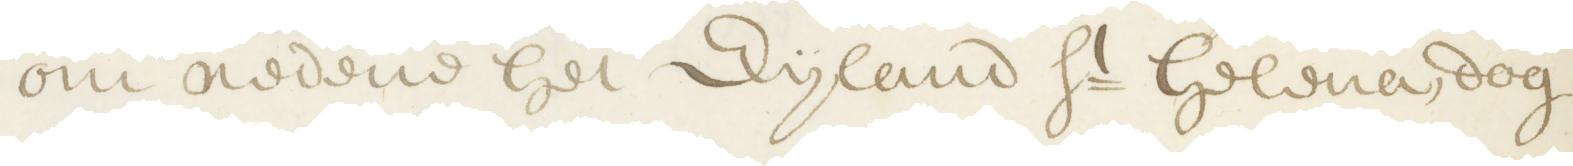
om redene het Eijland s=t Helena, dog
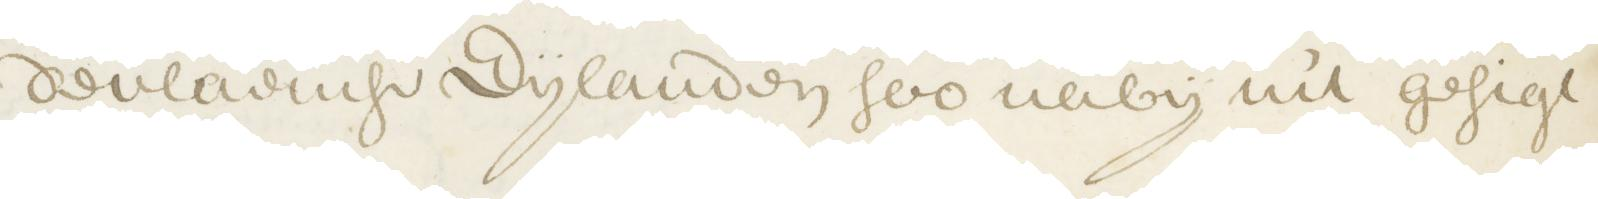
devlaemse Eijlanden soo nabij in't gesigt
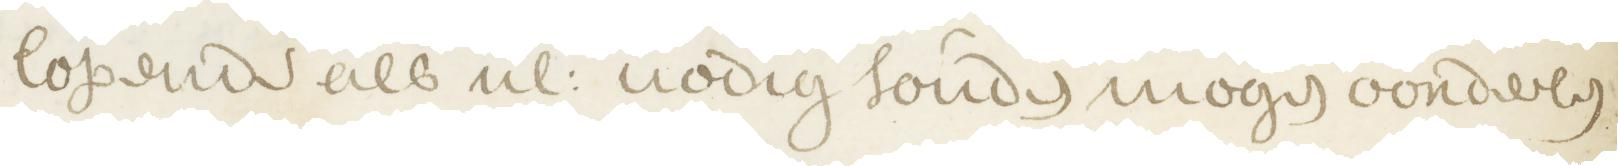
lopende als ul: nodig souden mogen oordeelen
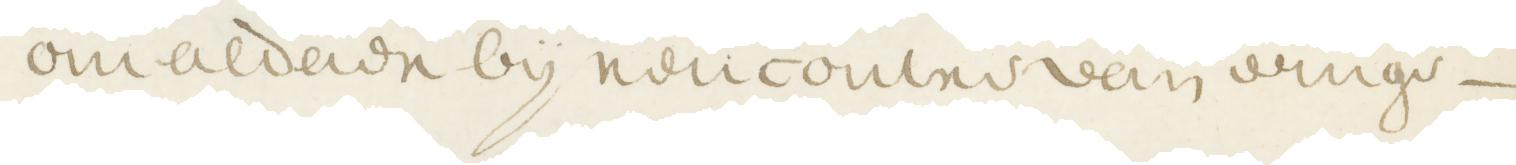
om aldaer bij rencontre van eenige
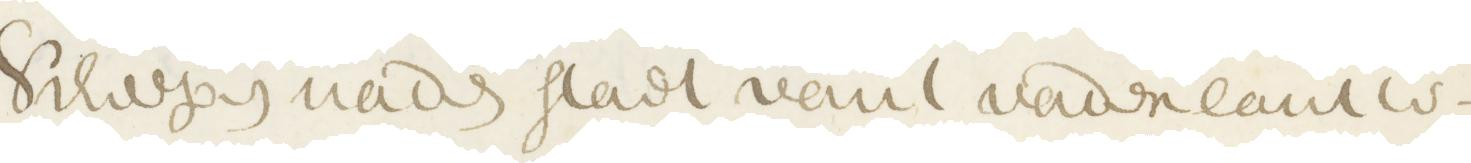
Scheepen naden staet van 't vaderlant te
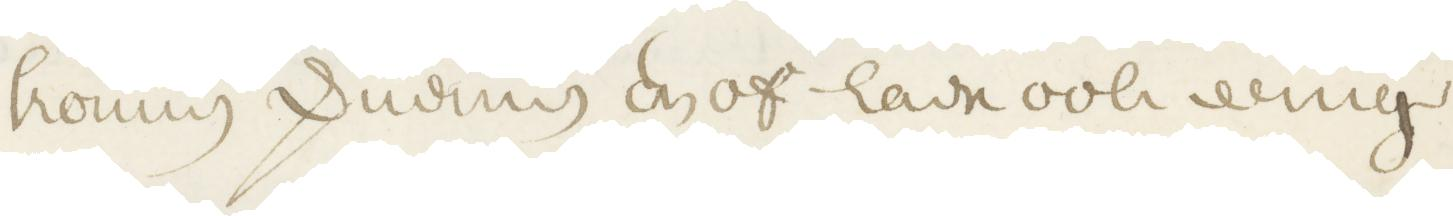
konnen vernemen en of haer ook eenige
